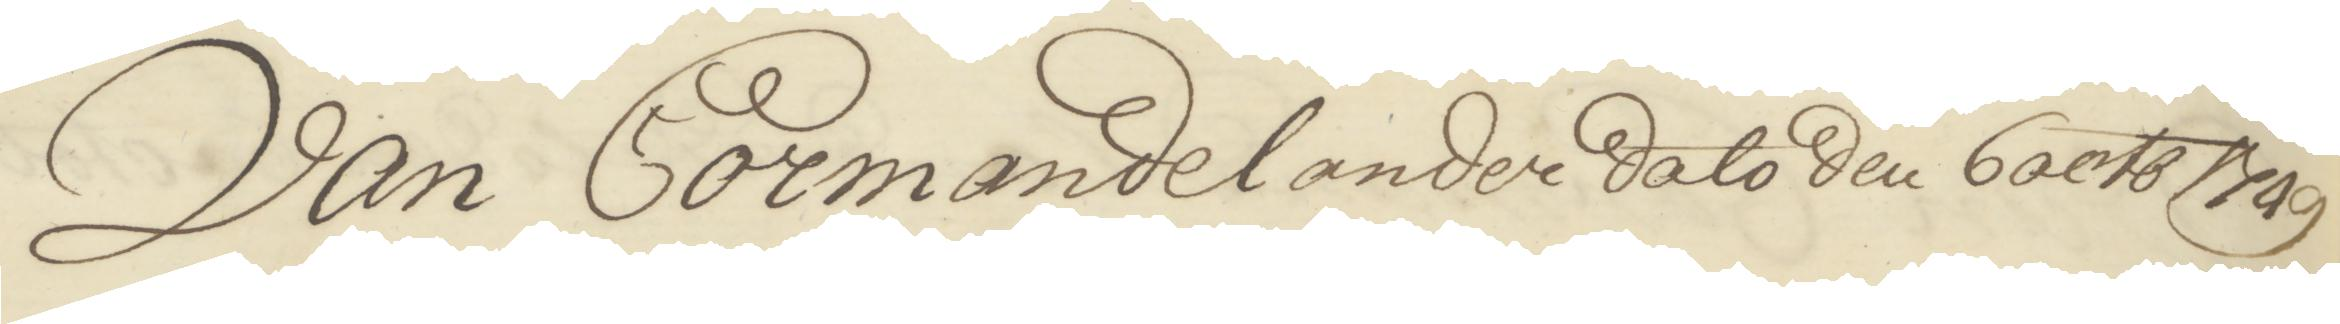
Van Cormandel onder dato den 6 octb 1749
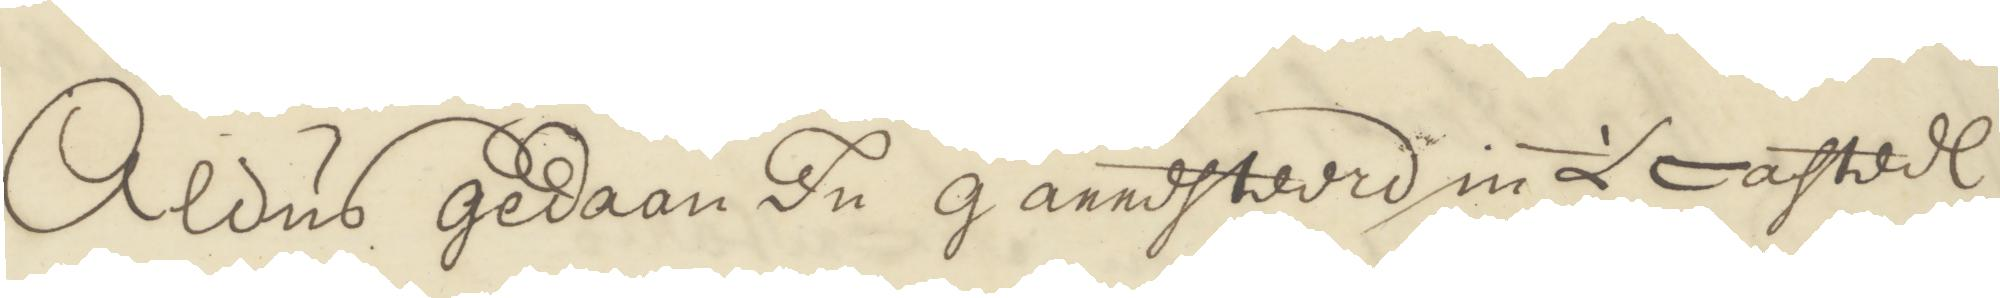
Aldus gedaan En g arresteerd in 't casteel
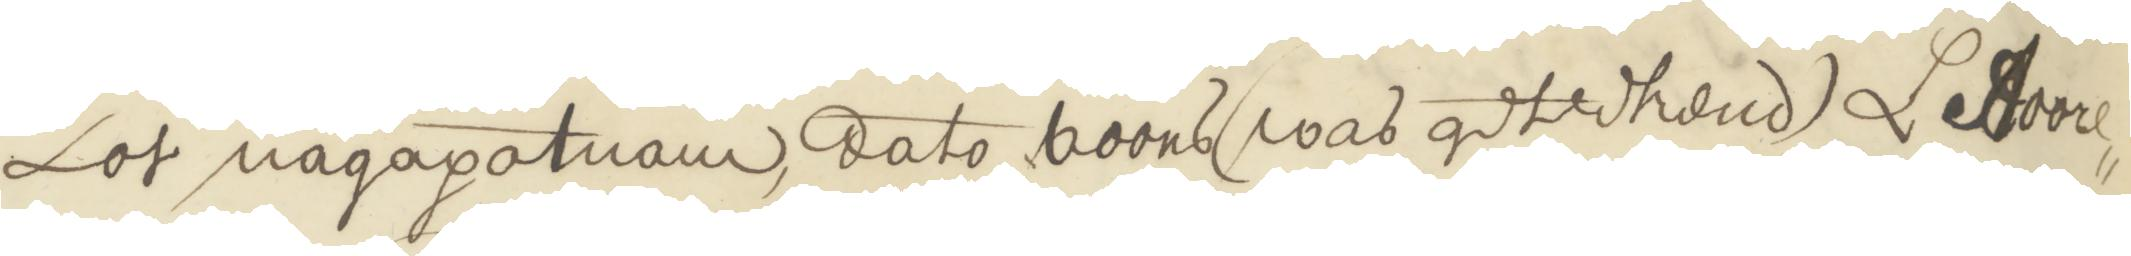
tot nagapatnam, dato voors (was geteekend) LToore„
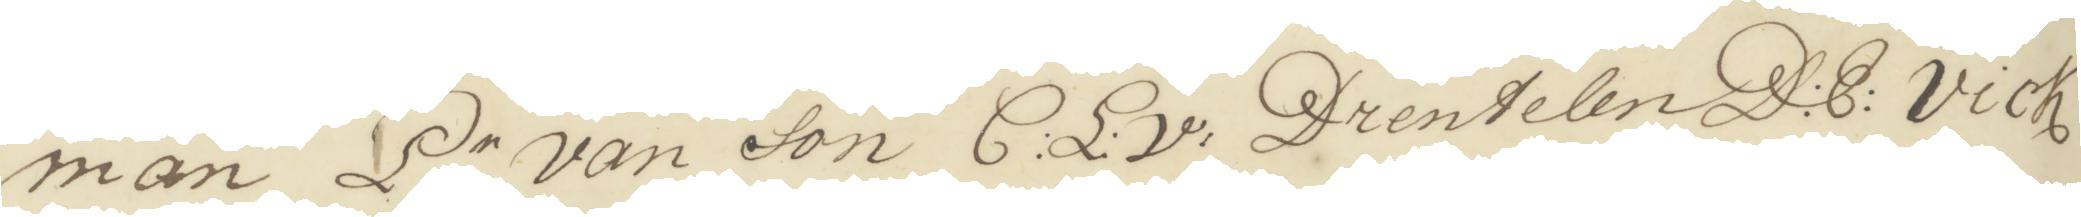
man P„r van son C: L: v: Drentelen D: E: Vick
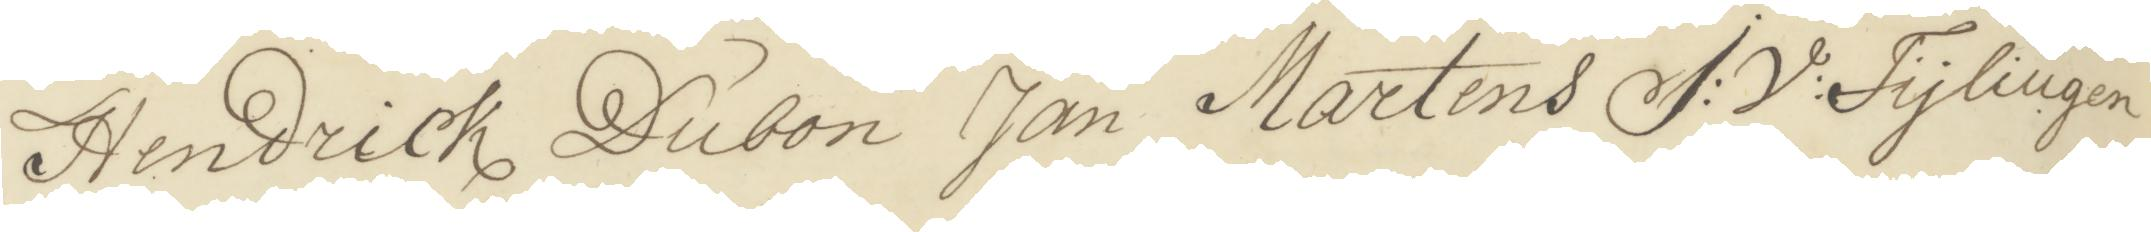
Hendrick Dubon Jan Martens I: V: Tijlingen
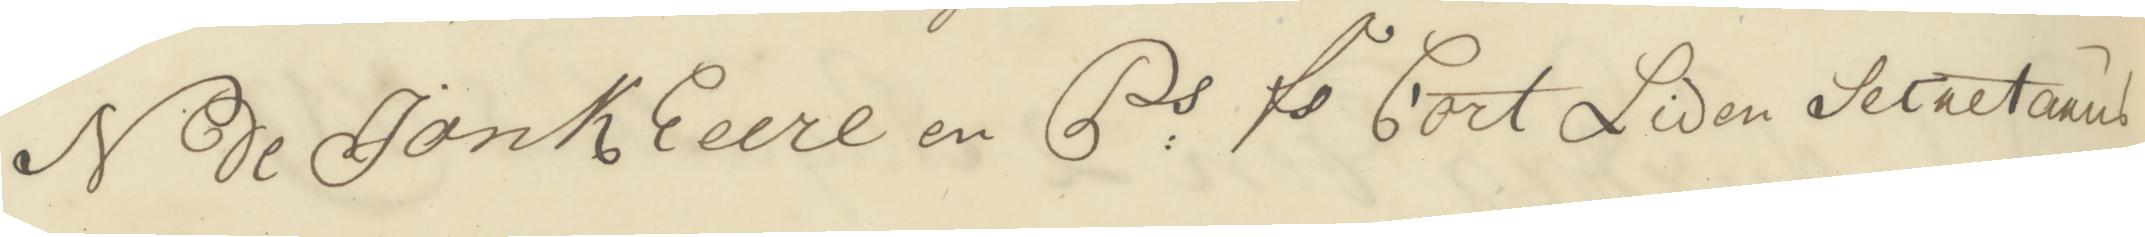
N de Ionkheere en P:s fs Cort Liden secretarus
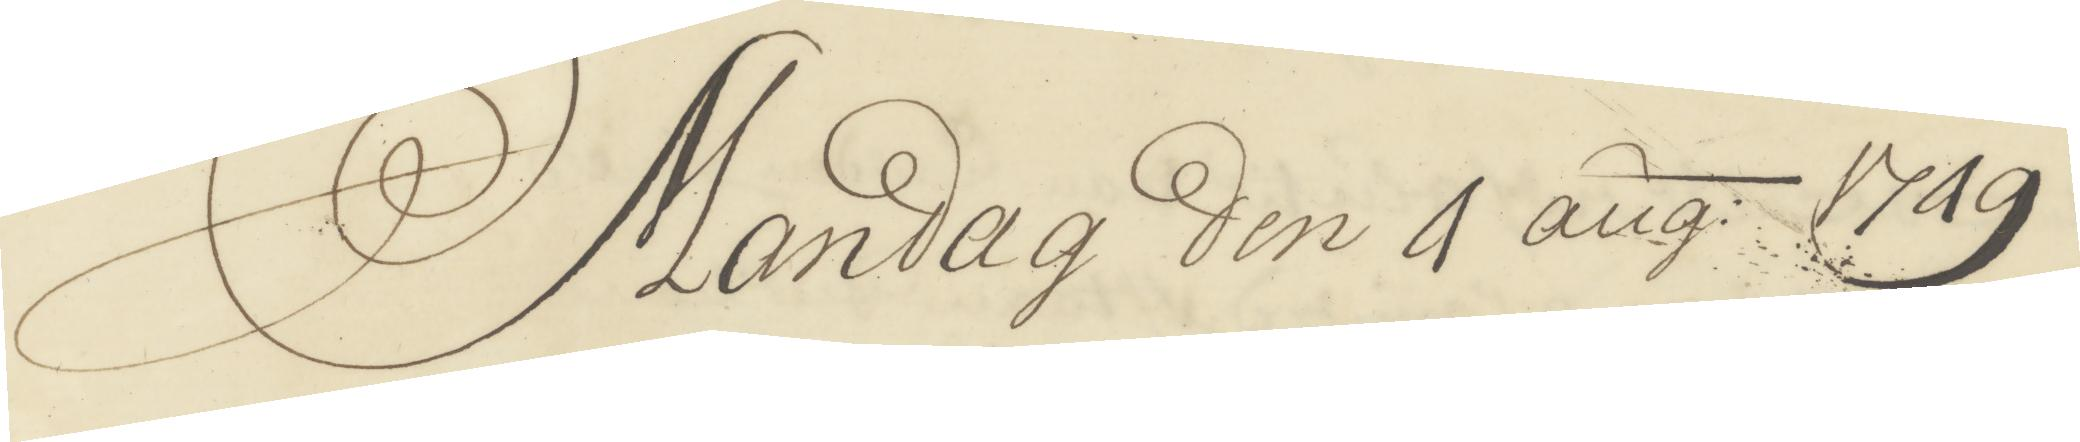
Mandag den 4 aug: 1749
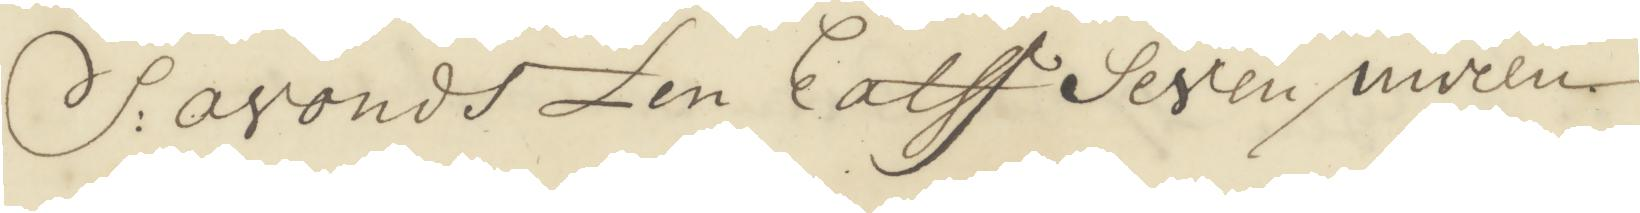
S: avonds ten halff seven uuren
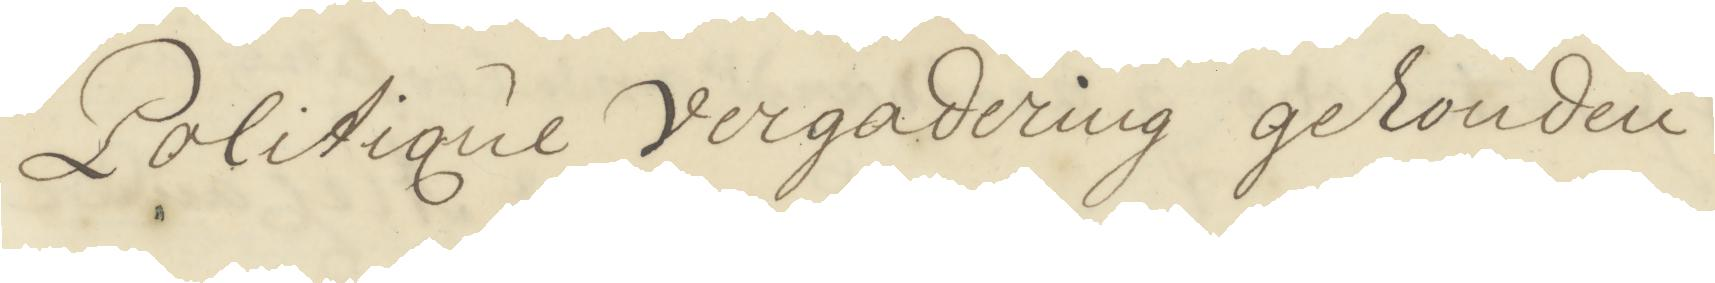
Politique vergadering gehouden
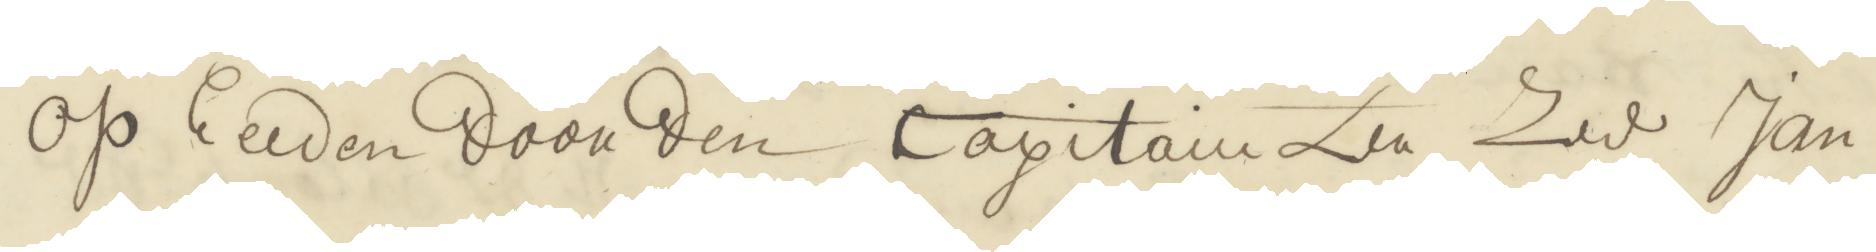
op heeden door den Capitain ter zee Jan
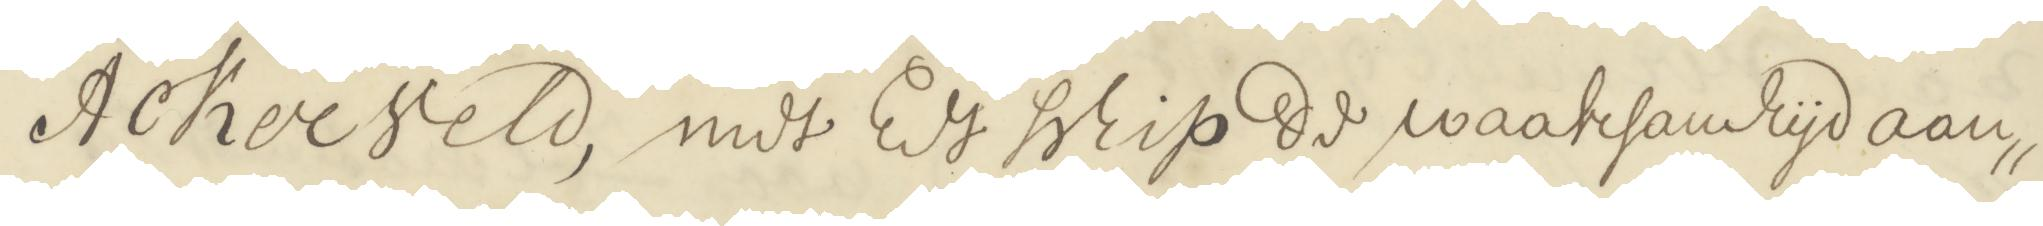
Ackerveld, met het schip de waaksamhijd aan„
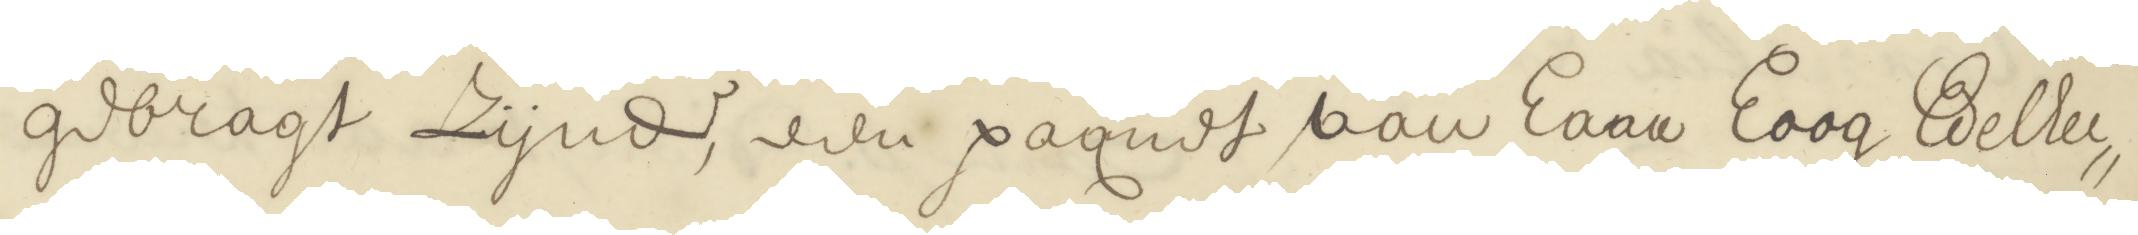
gebragt zijnde, een paquet van haar hoog Edelhee„
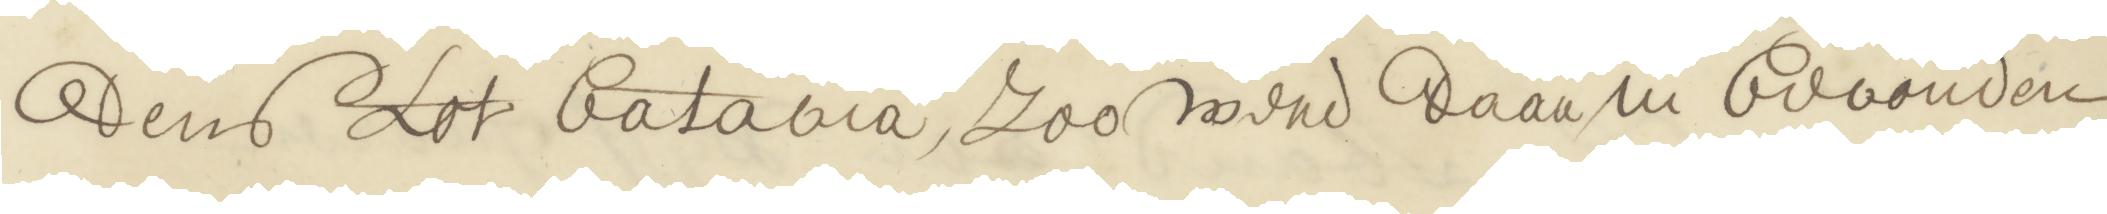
dens tot batavia, zoo werd daar in bevonden
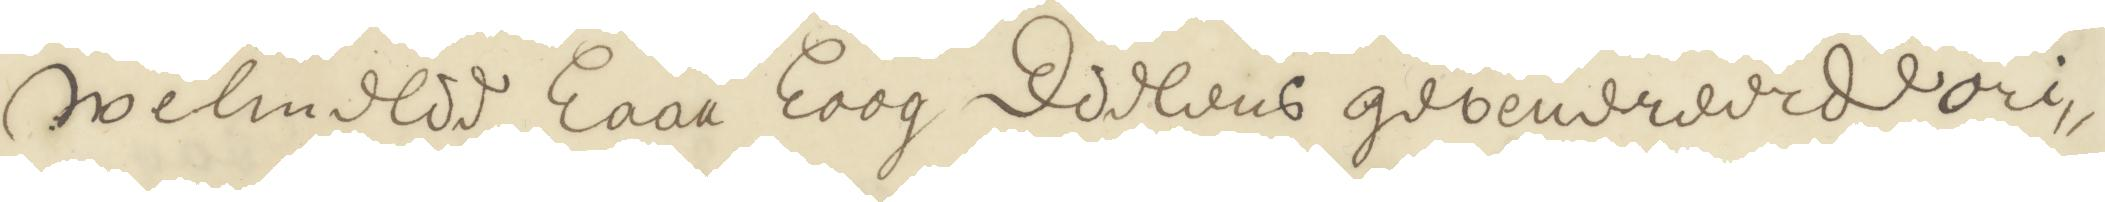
welmelde haar hoog Edelens gevenereerde ori„
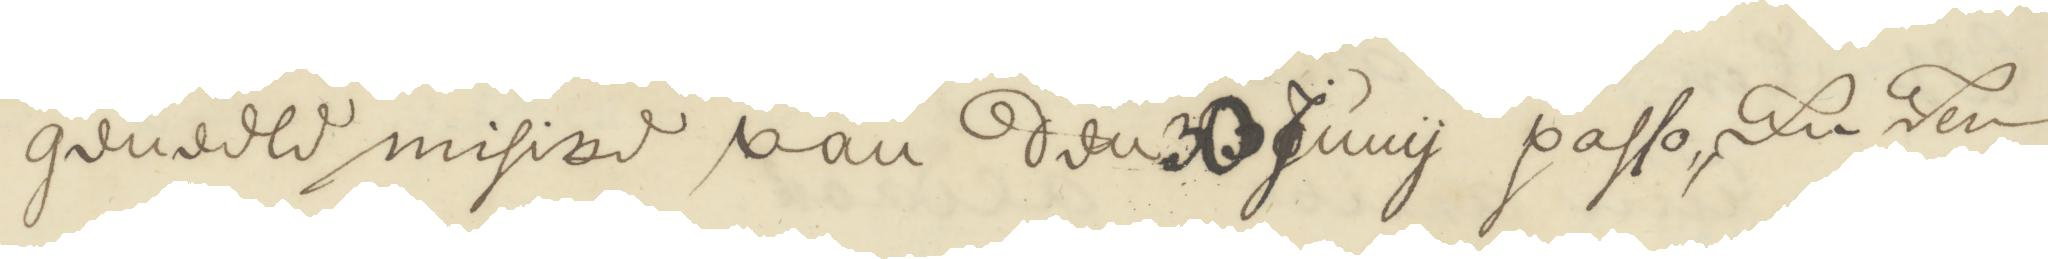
geneele misive van den 30 Junij passo, En Een
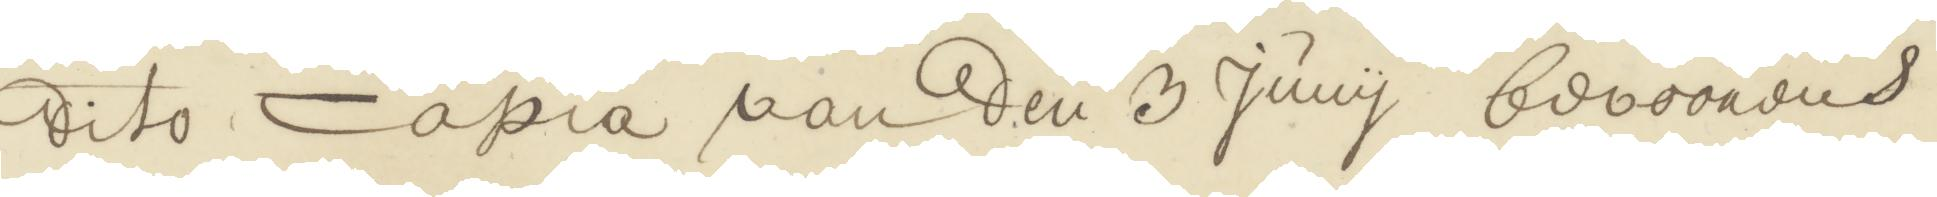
dito Copia van den 3 Junij bevoorens
